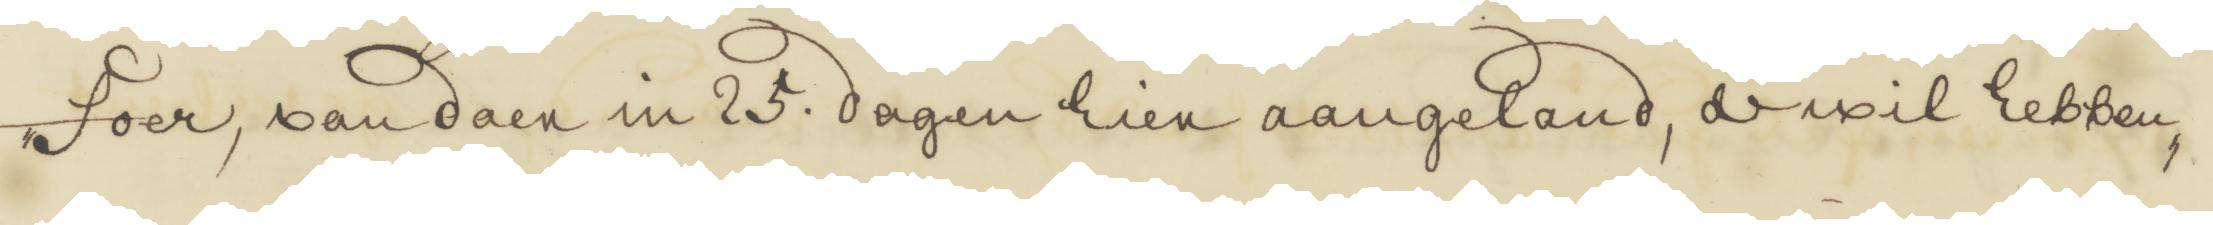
„foer, van daer in 25. dagen hier aangeland, de wil hebben„
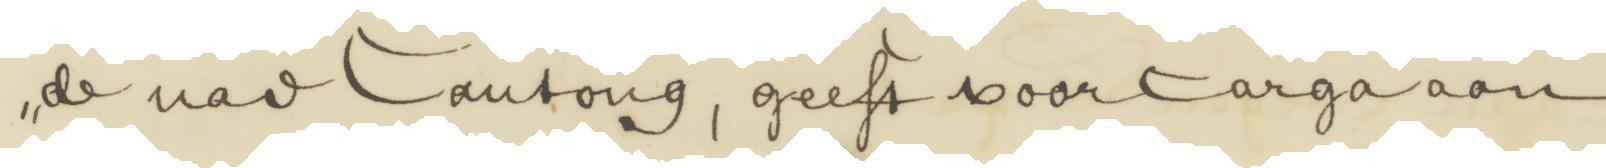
„de nae Cantong, geeft voor carga aan
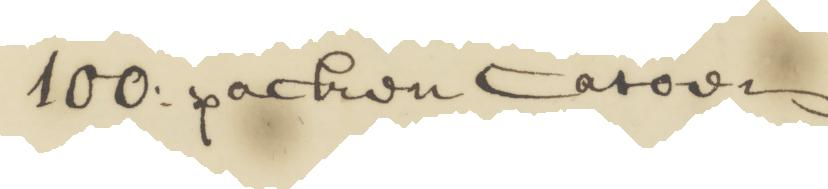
100: packen catoen
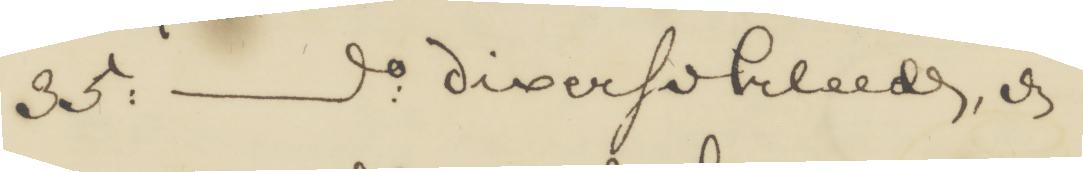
35: d:o diverse kleeden, en
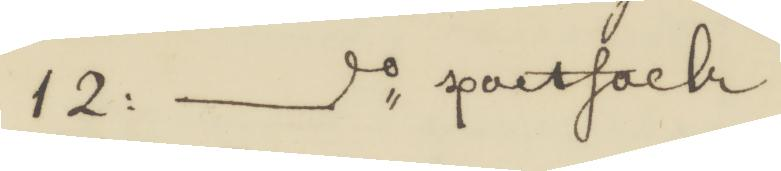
12: d„o poetsoek
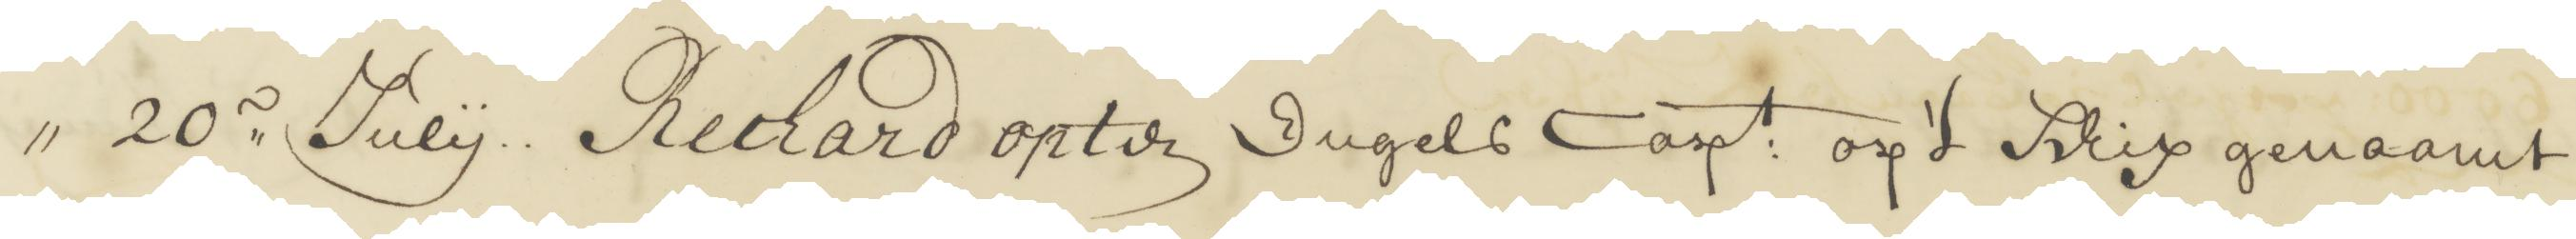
„ 20„e Iulij .. Rechard opten Engels Cap:t op 't schip genaamt
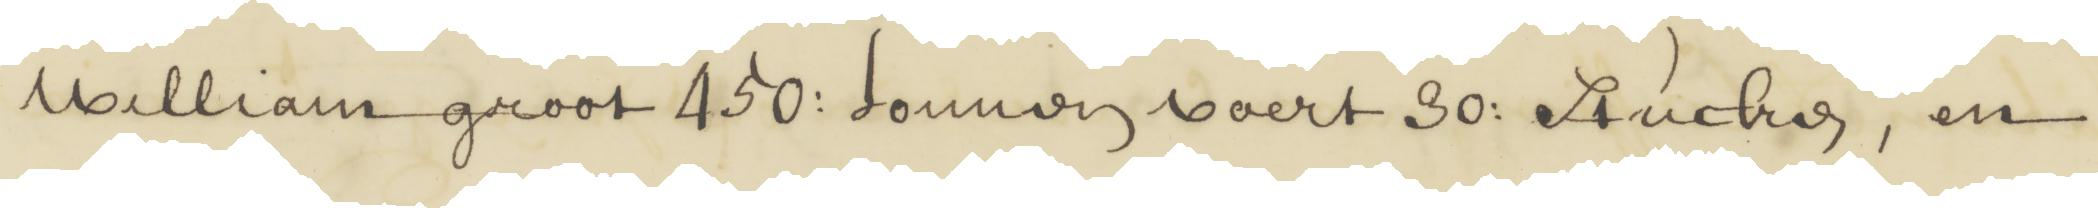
william groot 450: tonnen voert 30: stucken, en
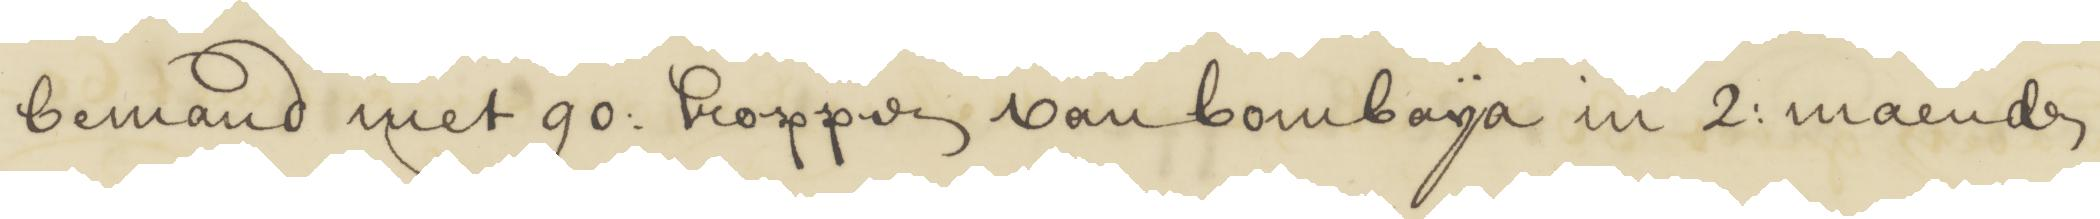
bemand met 90: koppen van bombaija in 2: maenden
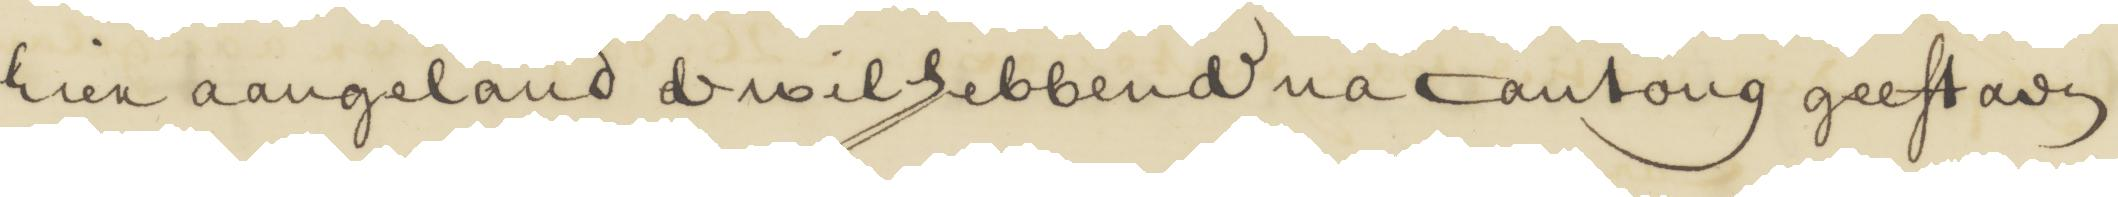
hier aangeland de wil hebbende na cantong geeft aen
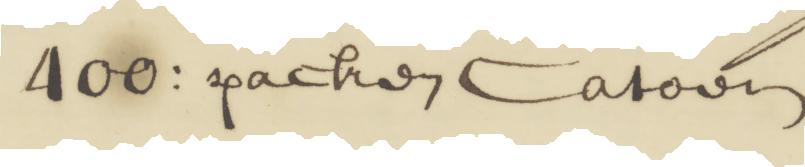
400: packen Catoen
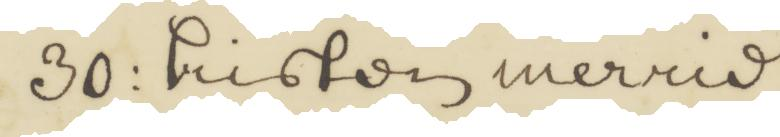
30: kisten merrie
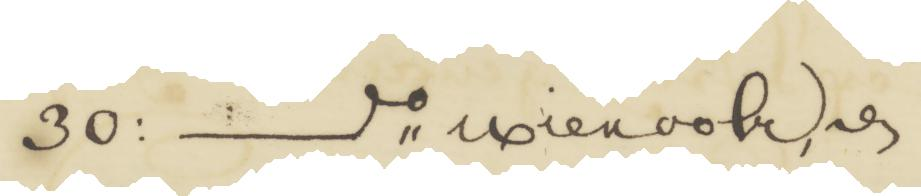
30: d„o wierook, en
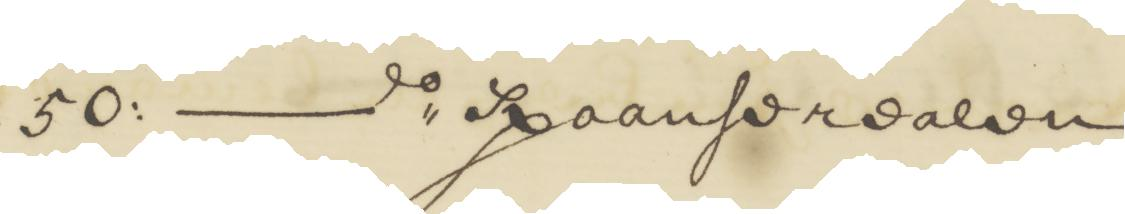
50: d„o spaanse realen
